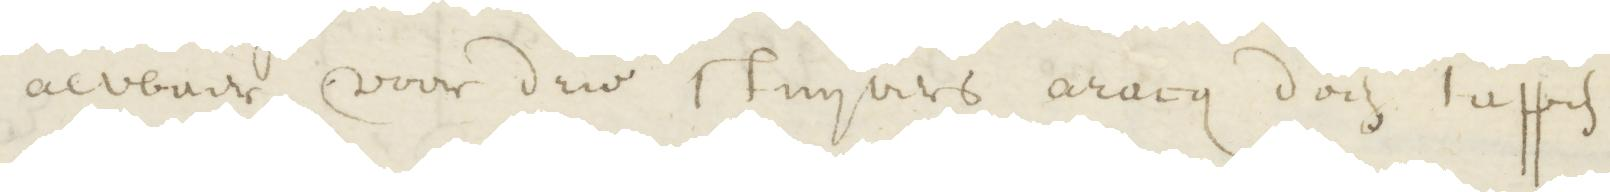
alwaer voor drie stuyvers aracq doen tappen
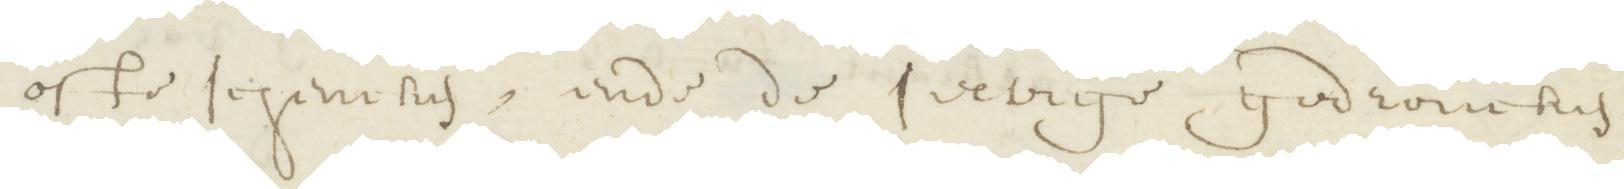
ofte schencken, ende de selvige gedroncken
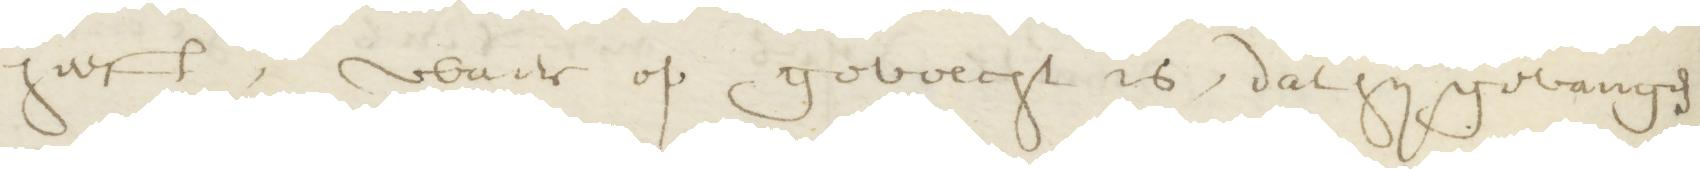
heeft, waer op gevolcht is, dat hy gevangen
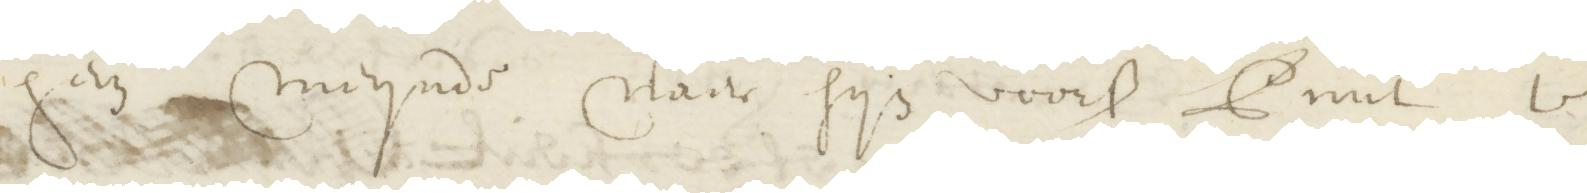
hem meynde naer syn voorsz Punt te
